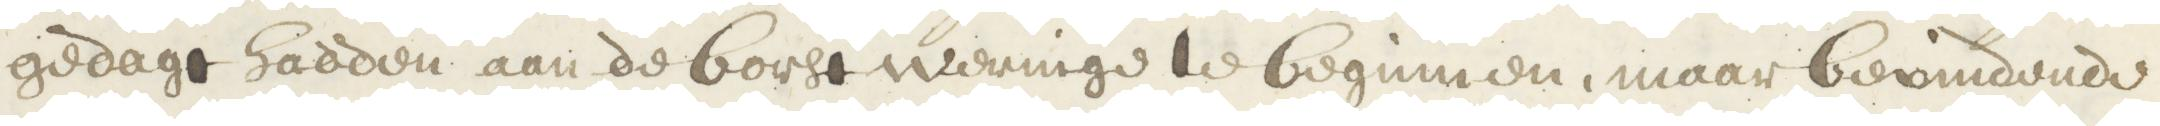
gedagt hadden aan de borst weringe te beginnen, maar bevindende
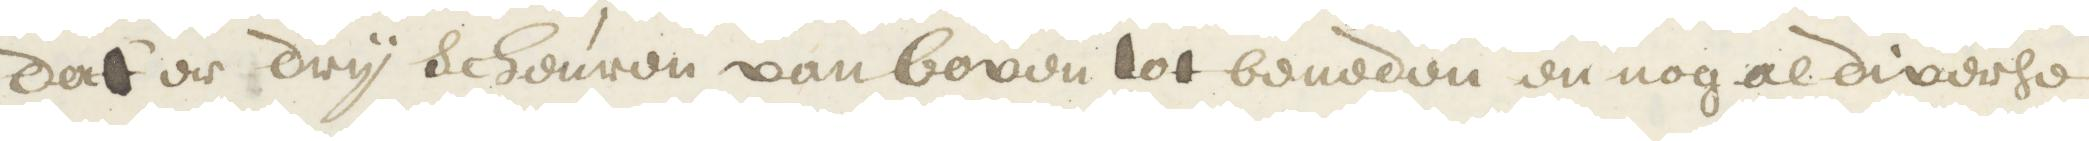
dat' er drij scheuren van boven tot beneden en nog al diverse
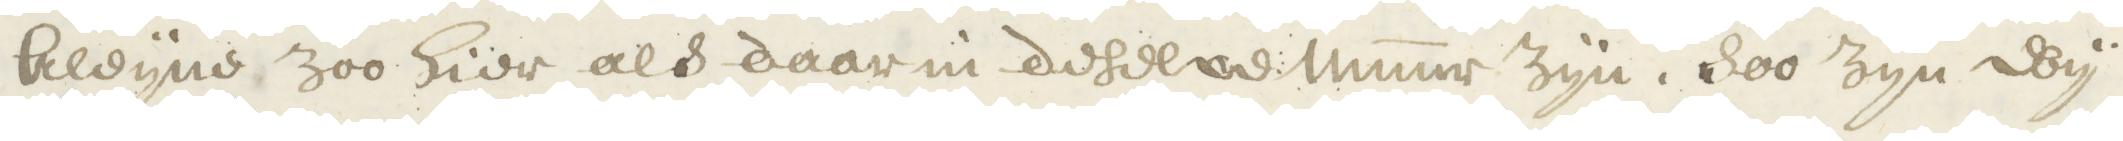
kleijne zoo hier als daar in deselve muur zijn, soo zijn wij
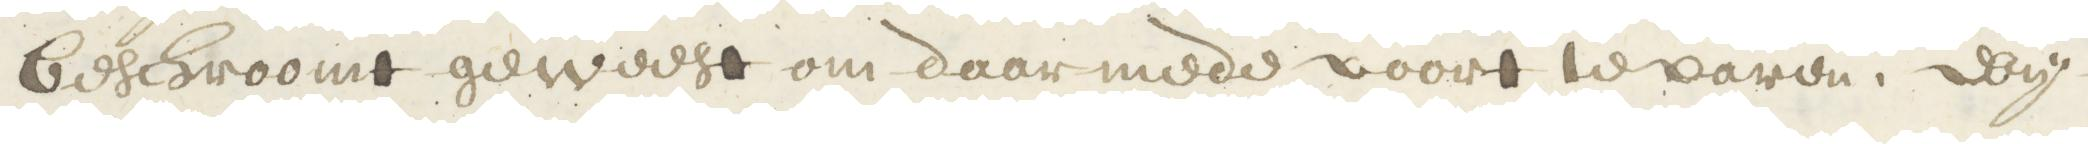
beschroomt geweest om daar mede voort te varen, wij
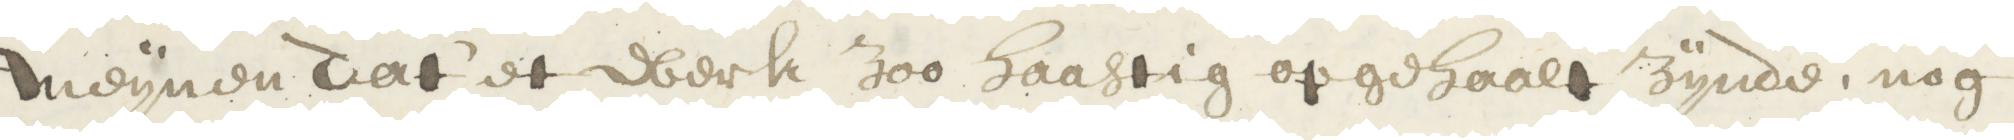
meijnen dat' et werk zoo haastig opgehaalt zijnde, nog
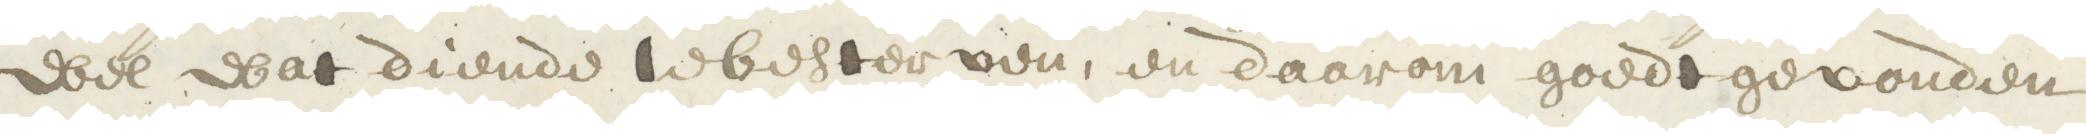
wel wat diende tebesterven, en daarom goedt gevonden
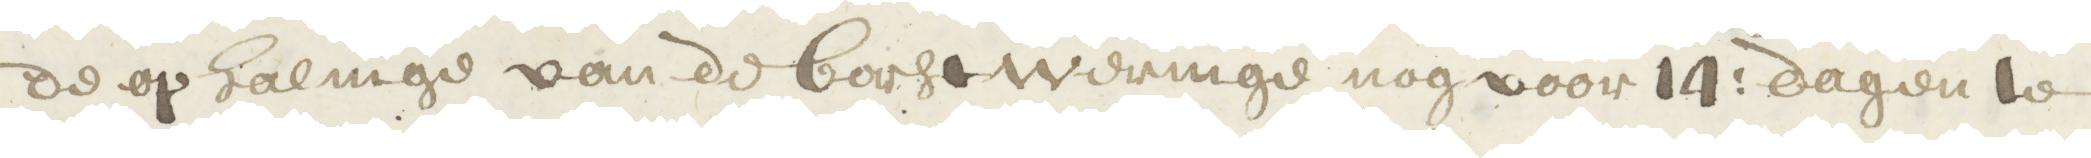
de ophalinge van de borst weringe nog voor 14: dagen te
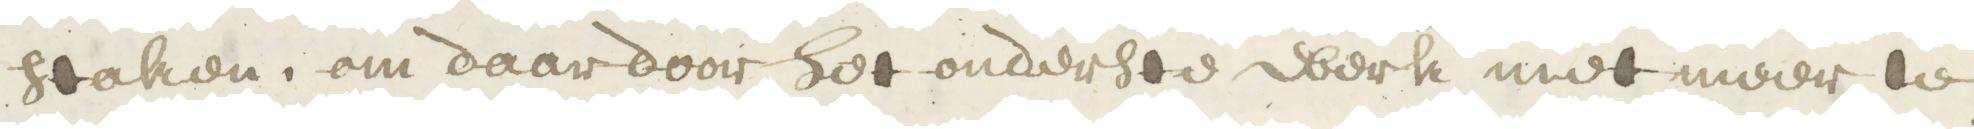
staken, om daar door het onderste werk niet meer te
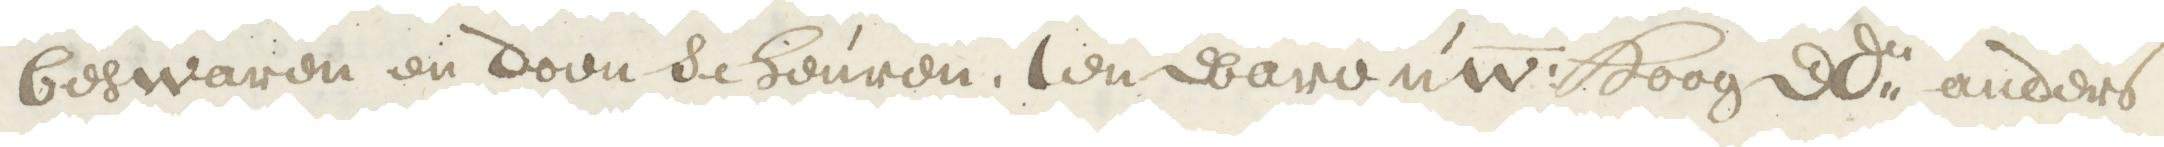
beswaren en doen scheuren. ten ware uw: Hoog Ed„en anders
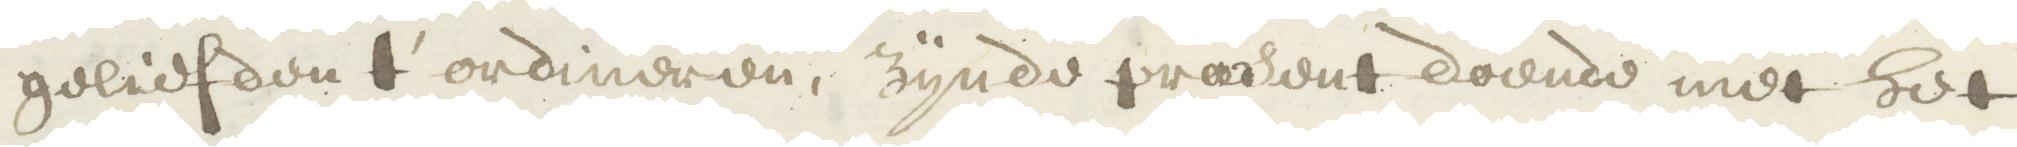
geliefden t' ordineren, zijnde praesent doende met het
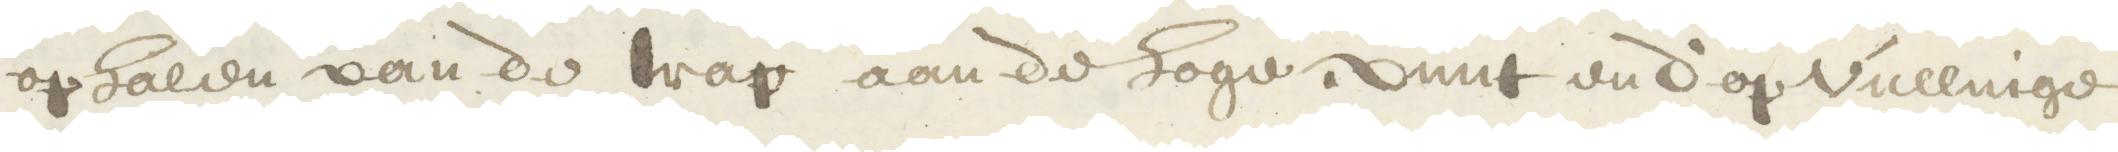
ophalen van de trap aan de hoge punt en d' opvullinge
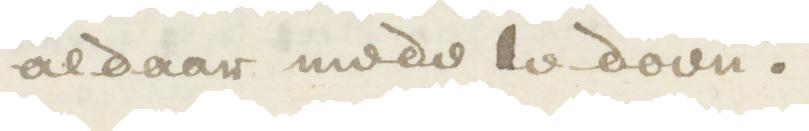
aldaar mede te doen.
